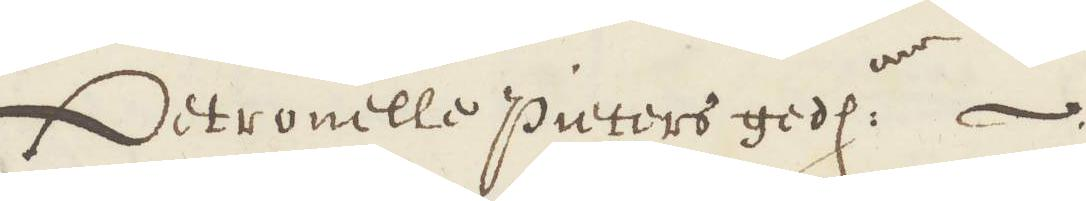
Petronelle pieters gedh:e —
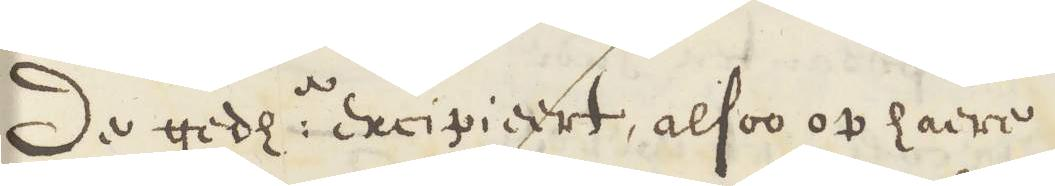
De gedh:e excipieert, alsoo op haere
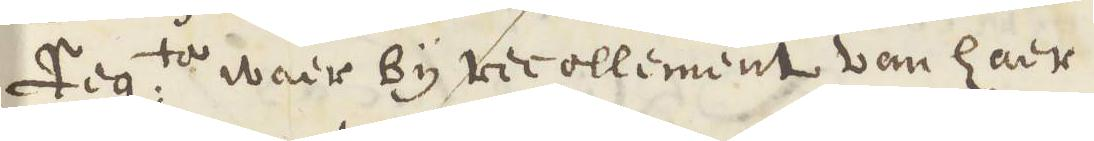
Reg:te waer bij reccollement van haer
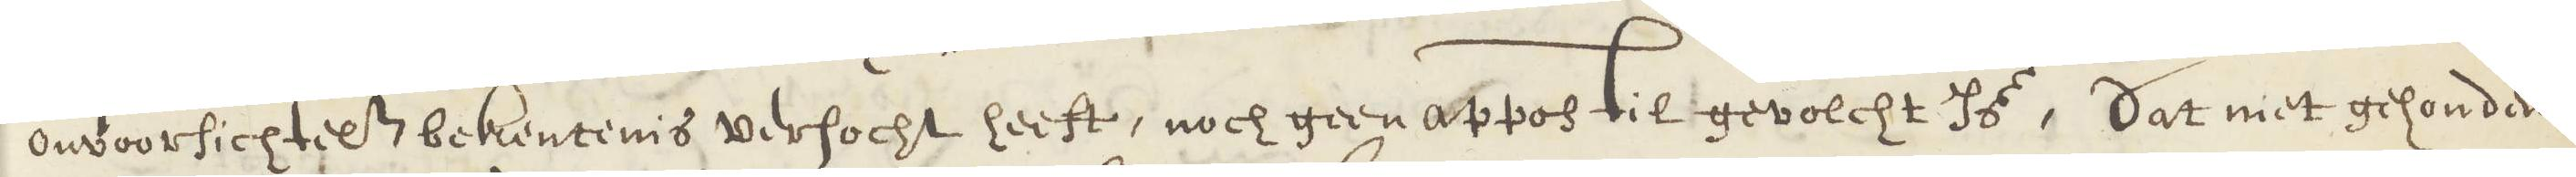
onvoorsichtelijk bekentenis versocht heeft, noch geen appostil gevolcht Is, dat niet gehouden
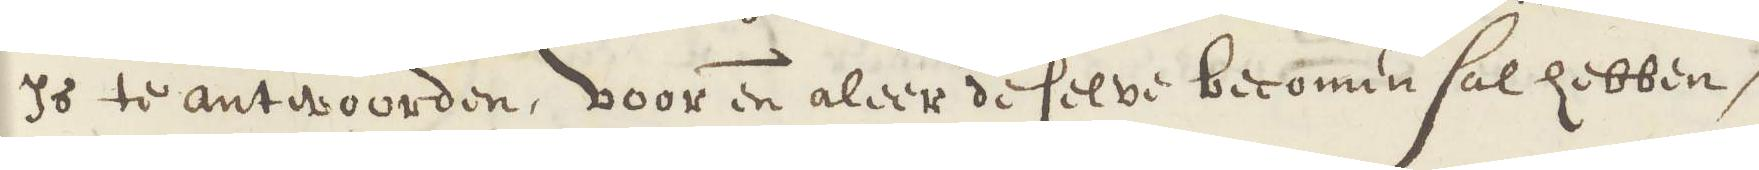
Is te antwoorden, voor ende aleer deselve becomen sal hebben,
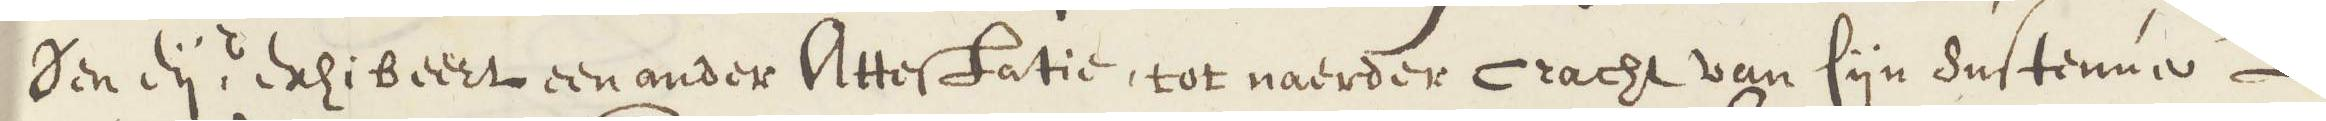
den eij:r exhibeert een ander Attestatie, tot naerder cracht van sijn sustenue —
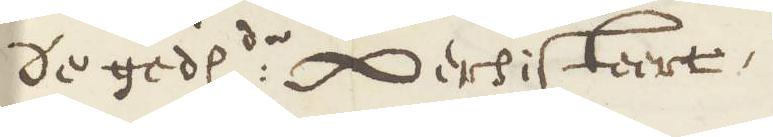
de gedh:de persisteert
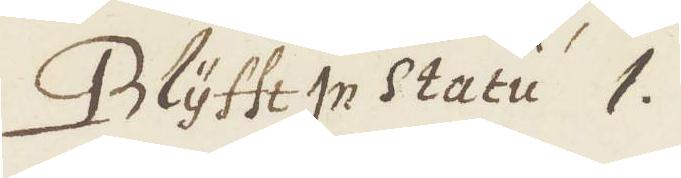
Blijfft jn statu /.
